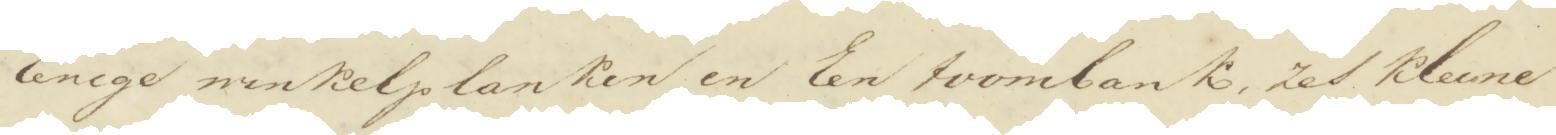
Eenige winkelplanken en Een toombank, zes kleine
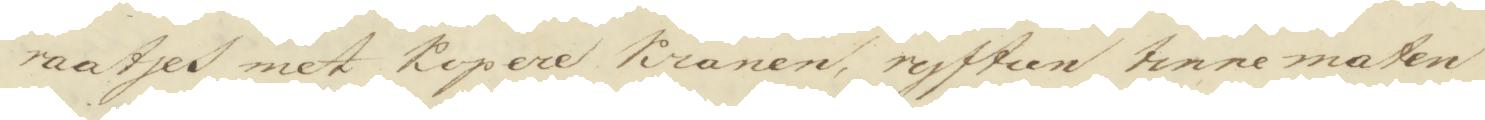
vaatjes met kopere kranen, vyftien tinne maten
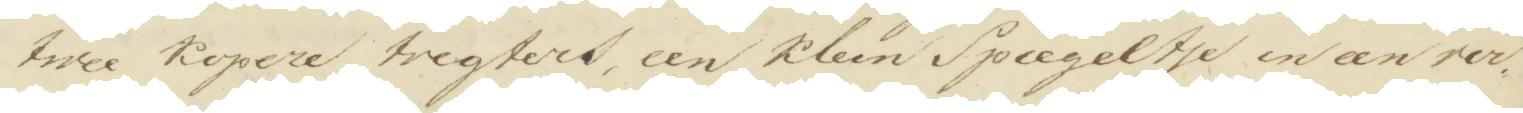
twee kopere tregters, een klein spiegeltje in een ver„
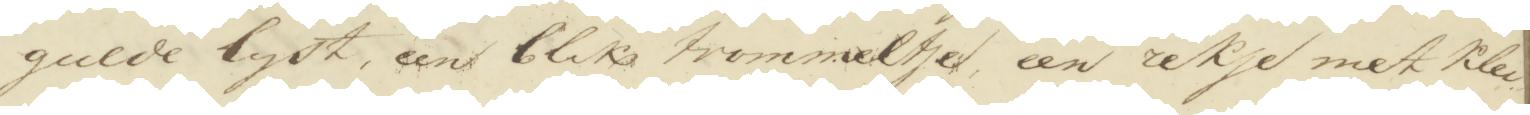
gulde lyst, een blik trommeltje, een rekje met klee,
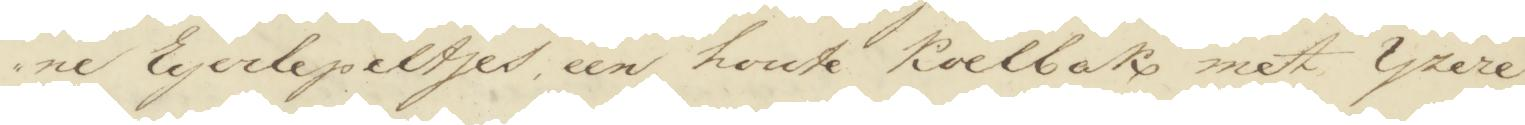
„ne Eijerlepeltjes, een houte Koelbak met Yzere
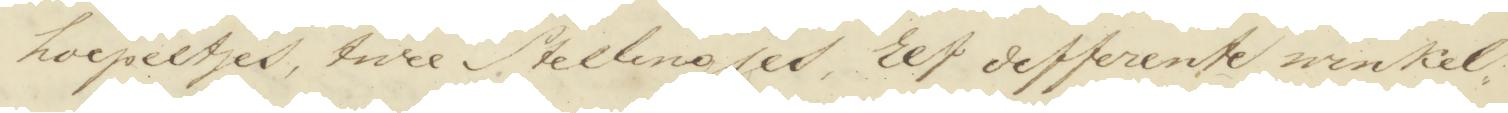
hoepeltjes, twee stellingjes, zes differente winkel„
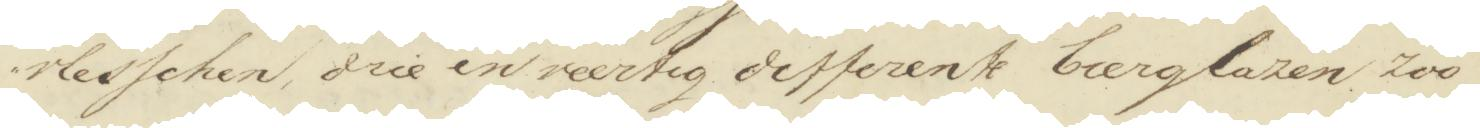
„vlesschen, drie en veertig differente bierglazen zoo
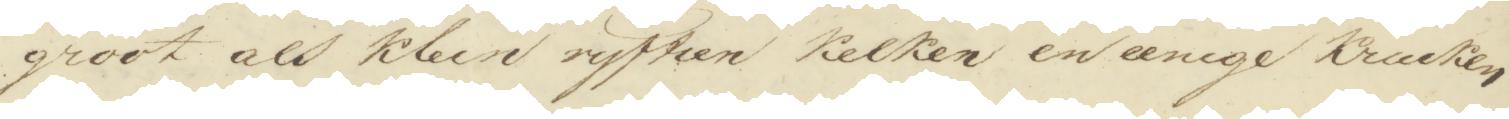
groot als klein vyftien kelken en eenige krucken
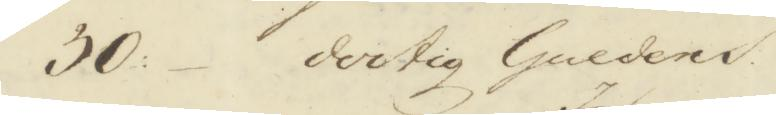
30: — dertig Guldens.
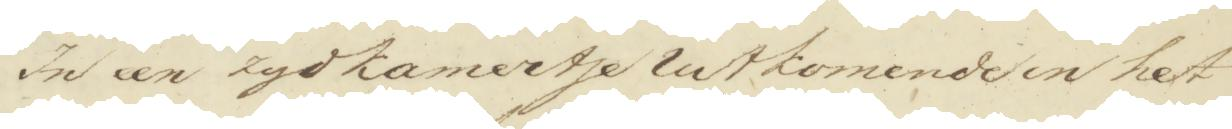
In een zydkamertje uitkomende in het
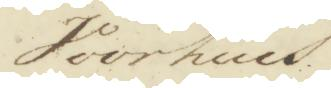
Voorhuis.
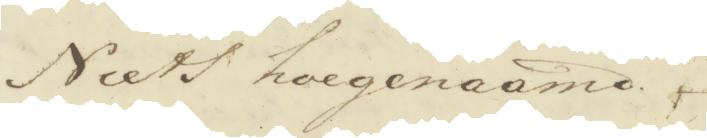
Niets hoegenaamd. -
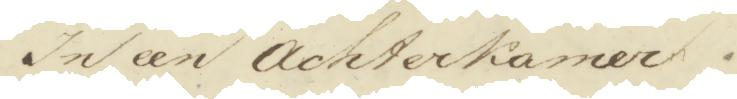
In een Achterkamer
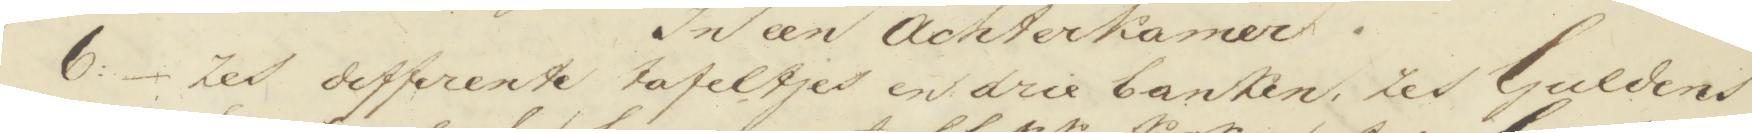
6: — zes differente tafeltjes en drie banken, zes Guldens
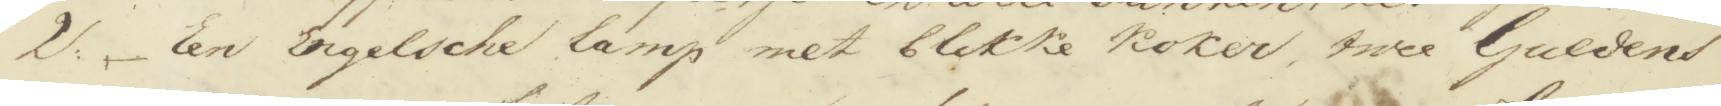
2: — Een Engelsche lamp met blikke koker, twee Guldens
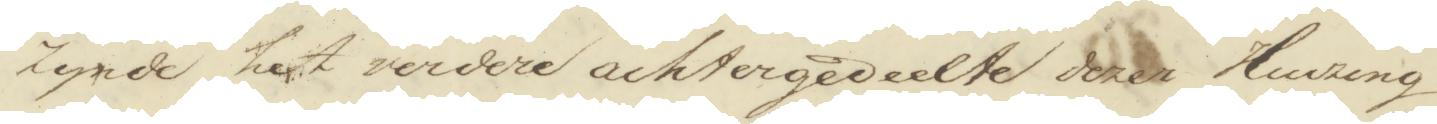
zynde het verdere achtergedeelte dezer Huizing
